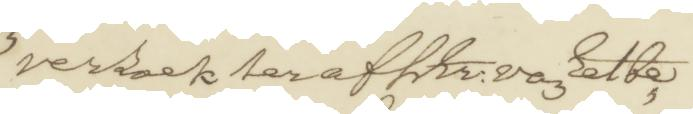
verzoek ter afschr: van het be„
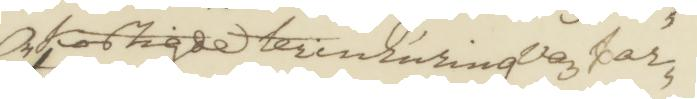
kostigde ter inhuring van par„
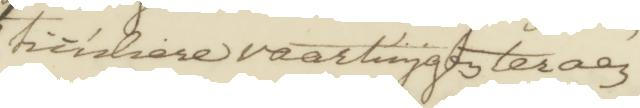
ticuliere vaartuijgen ter aan
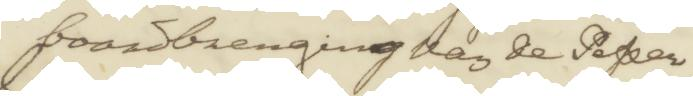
boordbrenging van de Peper
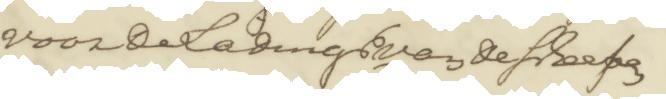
voor de ladings van de scheepen
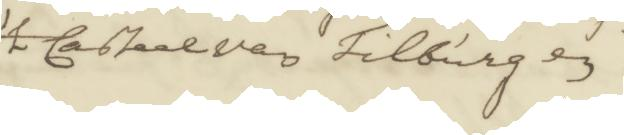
't Casteel van Tilburg en
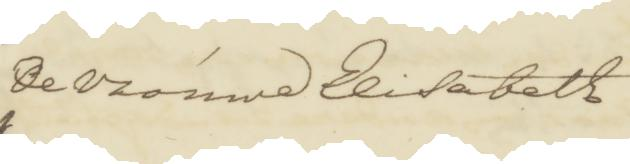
de vrouwe Elisabeth
